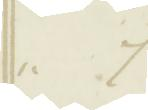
„ 7
